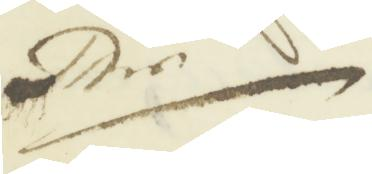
Phr
